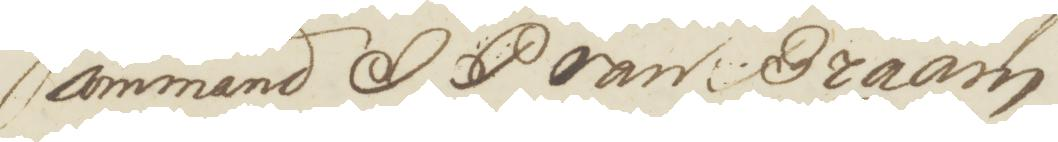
command I P van Braam,
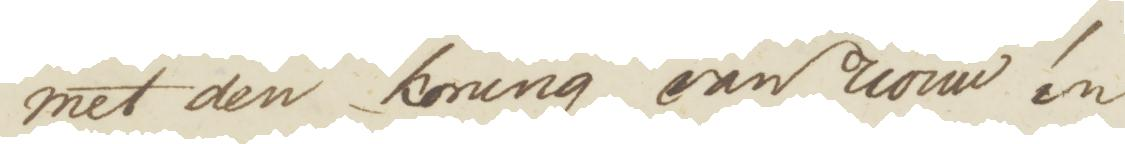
met den koning van Riouw in
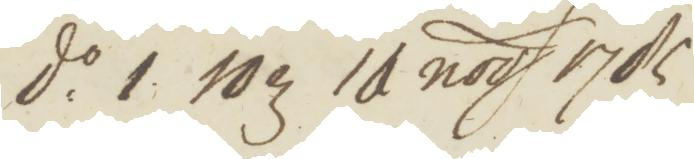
d:o 1 10en 14 nov 1785
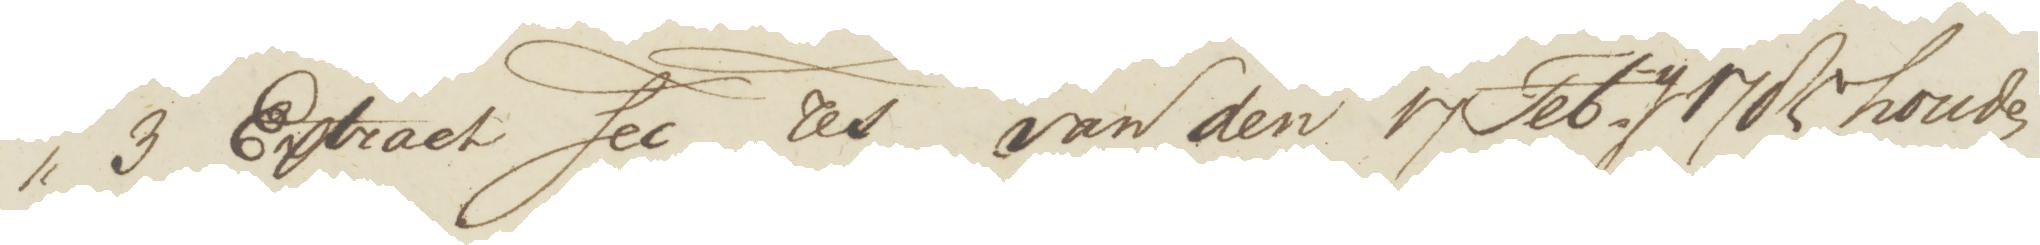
„ 3 Extract sec res van den 17 Feb:y 1785 houden
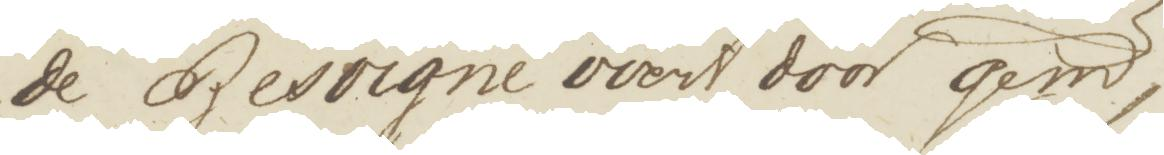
de Besoigne over t door gem
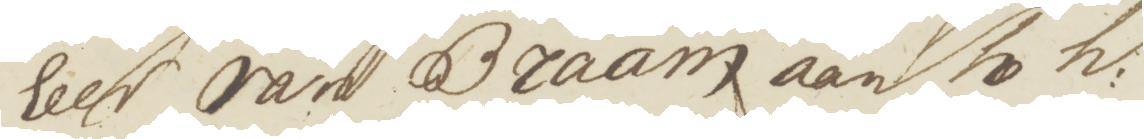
heer van Braam aan h h:
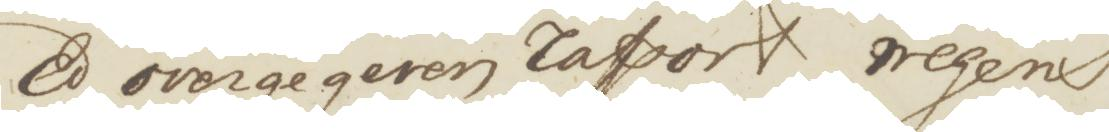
Ed overgegeven rapport wegens
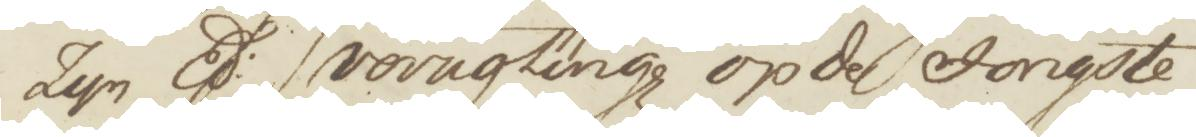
zijn Ed: verrigtinge op de Iongste
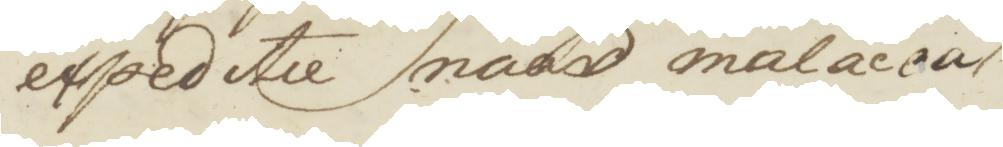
expeditie naar Malacca
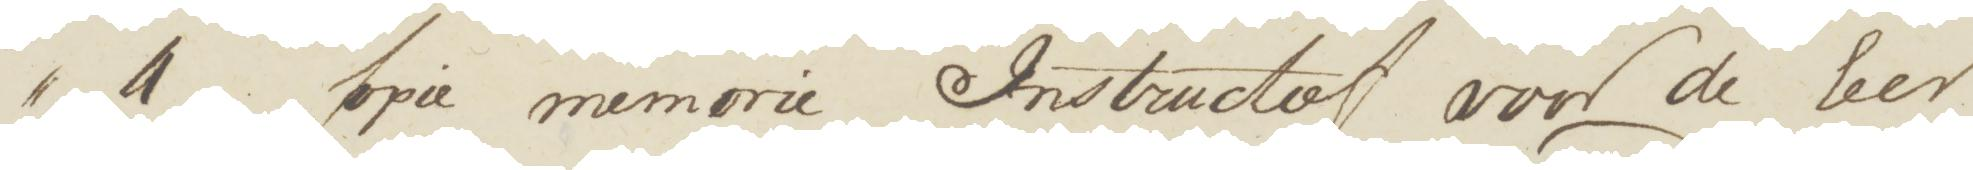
„ 4 Copie memorie Instructief voor de heer
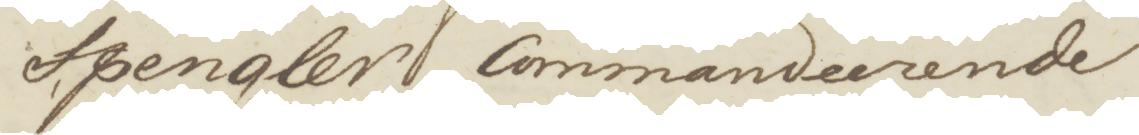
spengler commandeerende
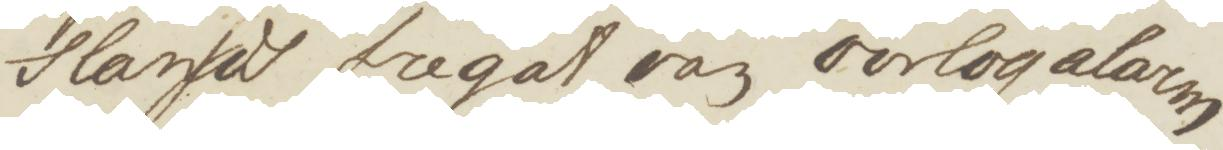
slands fregat van oorlog alarm
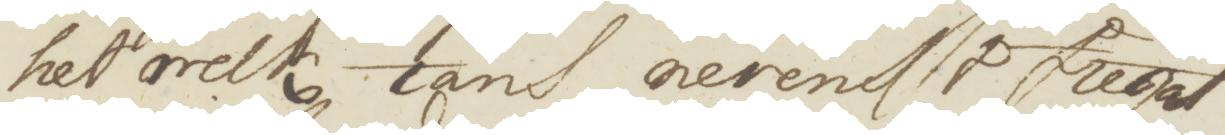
het welk tans nevens t fregat
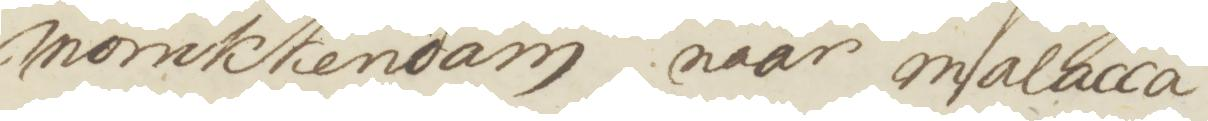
monikkendam naar malacca
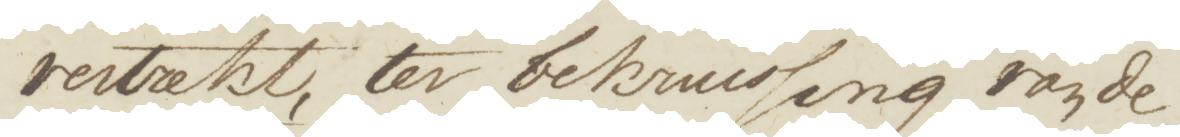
vertrekt ter bekruissing van de
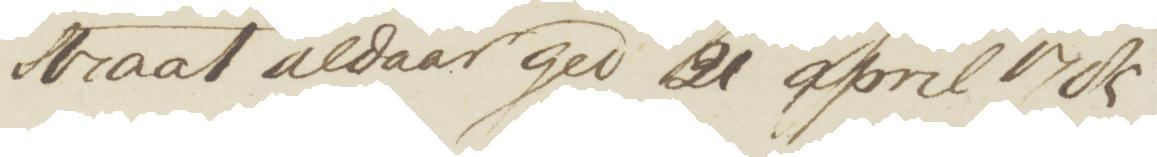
straat aldaar ged 21 april 1785
